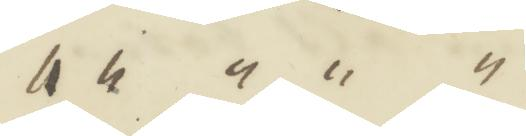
4 „ „ „ „
